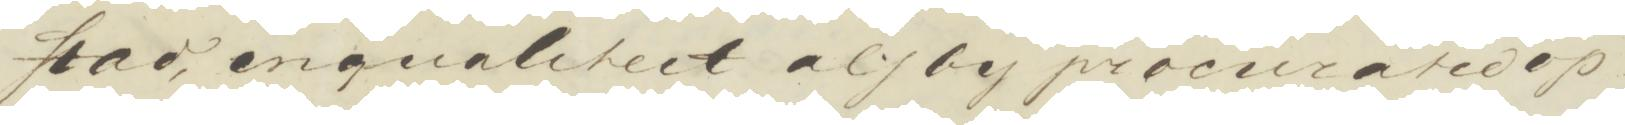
stad, en qualiteit als by procuratie op
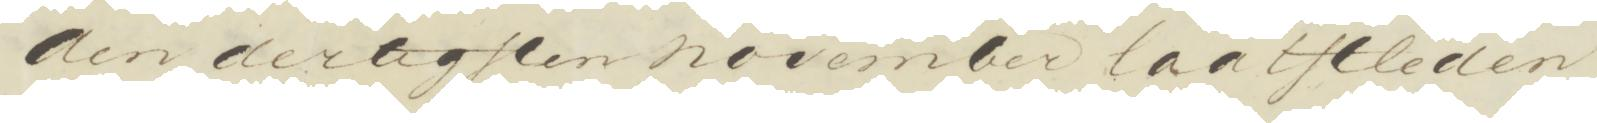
den dertigsten November laatstleden
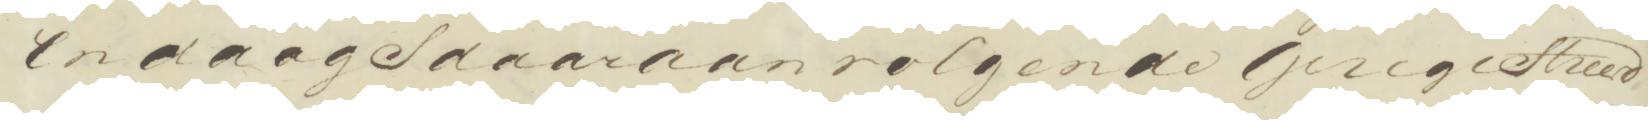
En daags daaraan volgende Geregistreerd
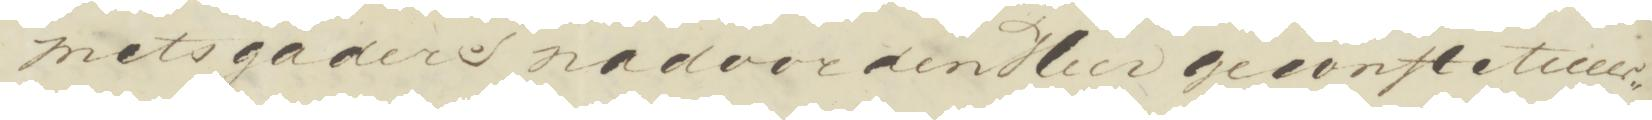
mitsgaders na door den Heer geconstitueer„
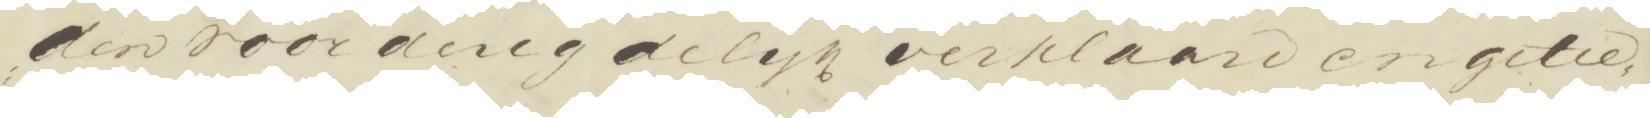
,den voor deugdelyk verklaard en getee„
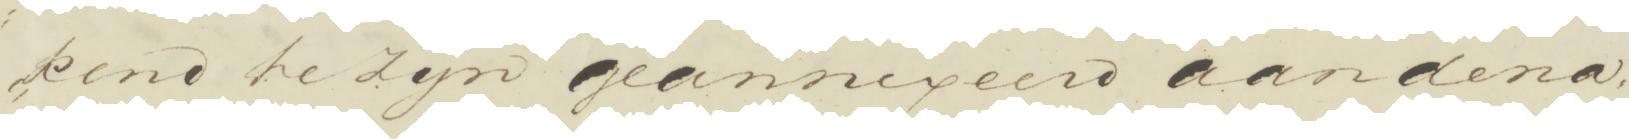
„kend te zyn geannexeerd aan de na
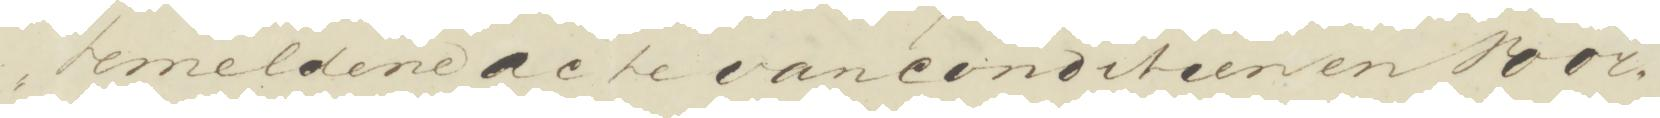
„temeldene acte van conditien en voor„
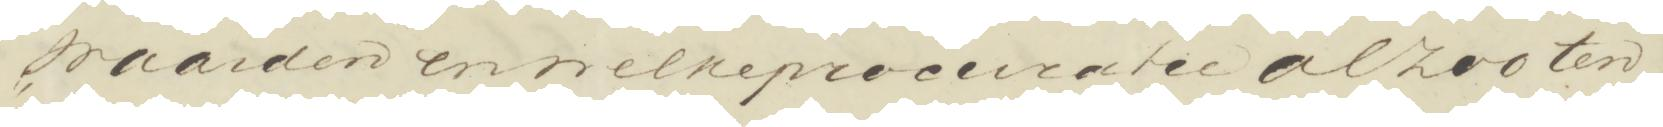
„waarden en welke procuratie alzoo ten
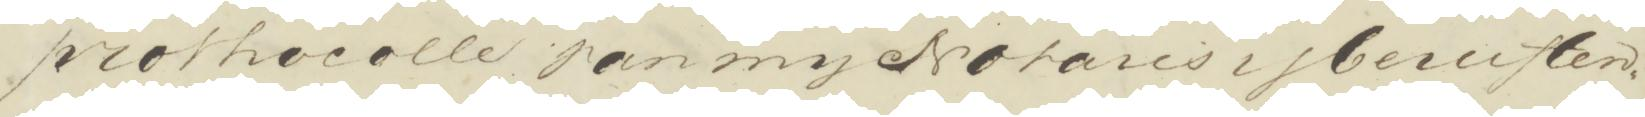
prothocolle van my Notaris, is berusten
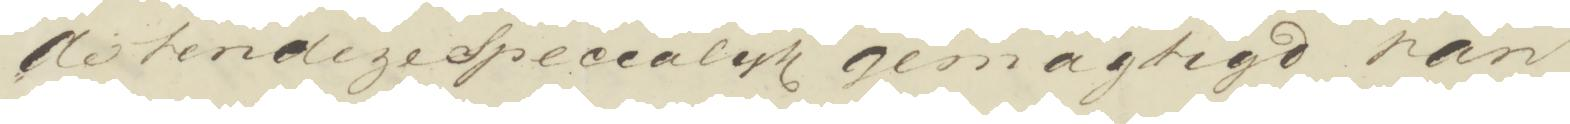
„de ten deze specialyk gemagtigd van
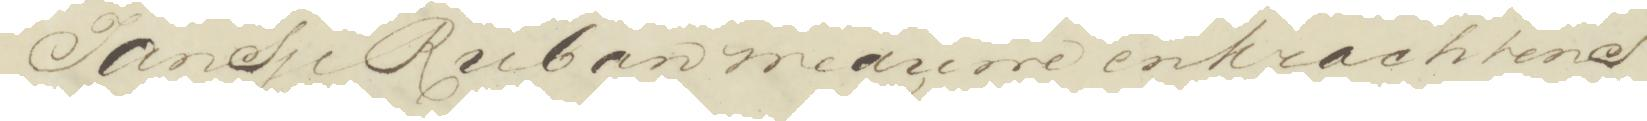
Iansje Ruban weduwe en krachtens
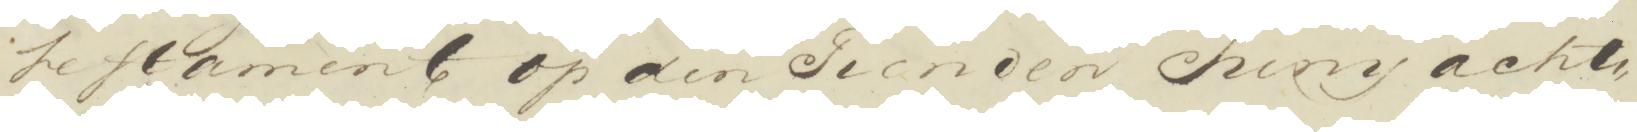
testament op den Tienden Iuny acht„
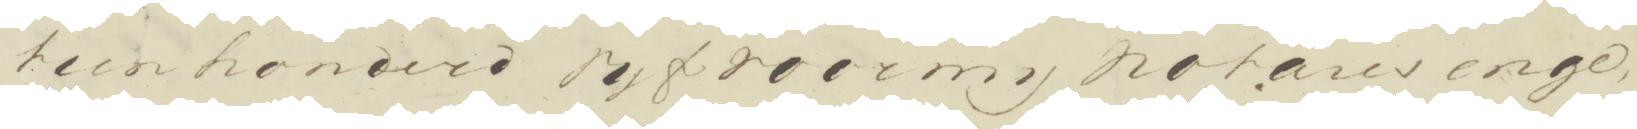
tien honderd vyf voor my notaris en ge,
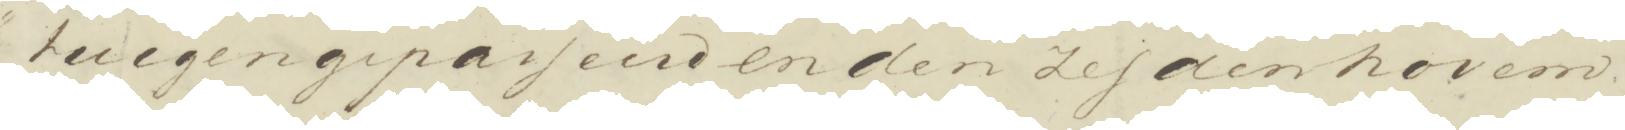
„tuigen gepasseerd en den zesden Novem
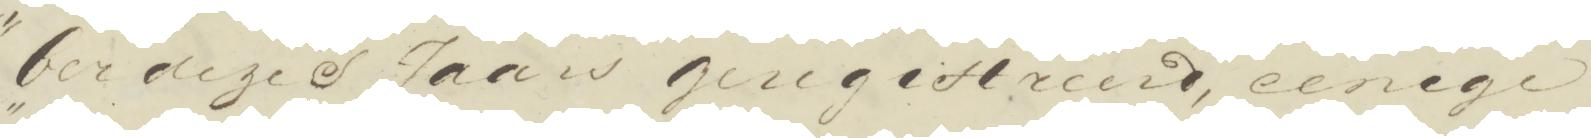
„ber dezes Jaars Geregistreerd, eenige
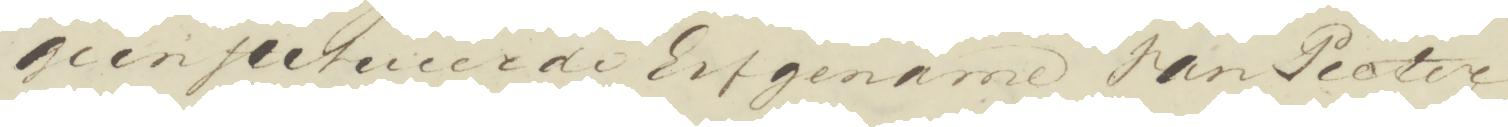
geinstitueerde Erfgename Van Pieter
